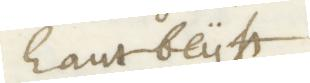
hant blijft
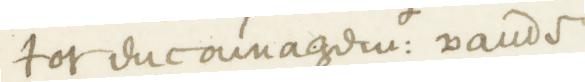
tot encouragem:t vande
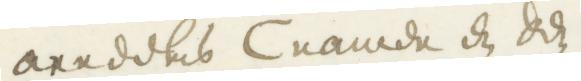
arreeks Cramer en den
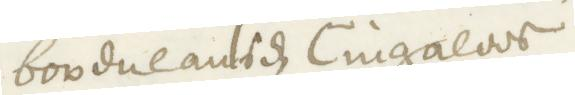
bovenlantsen Cingalees
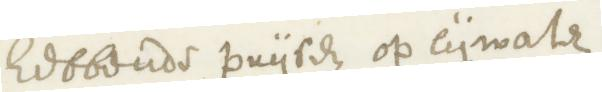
hebbende prijsen op lijwaten
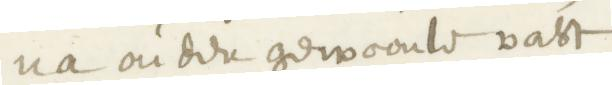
na ouder gewoonte vast
